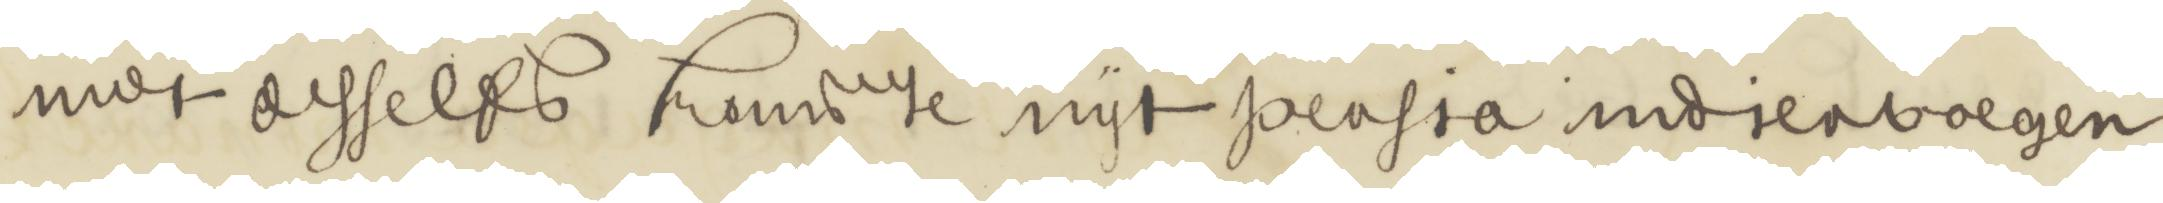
met desselfs komste uijt persia indiervoegen
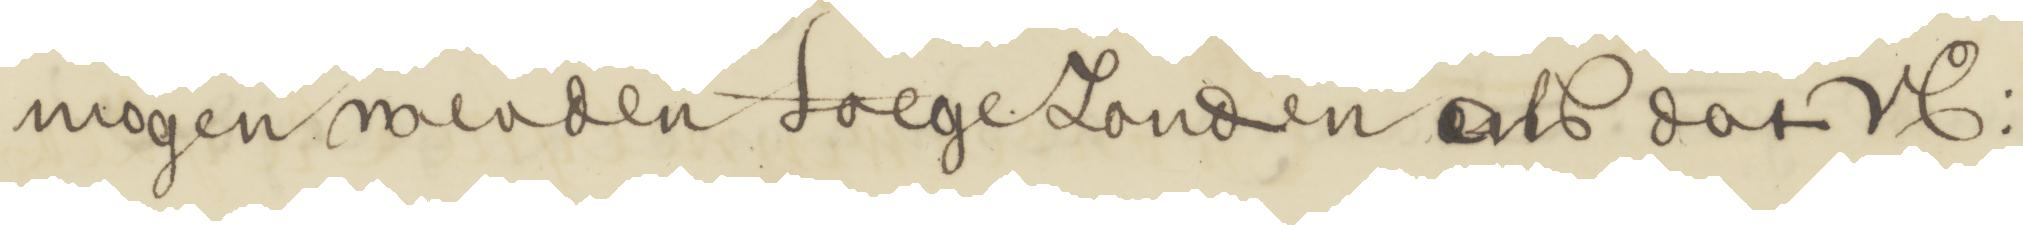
mogen werden toegezonden als dat VE:
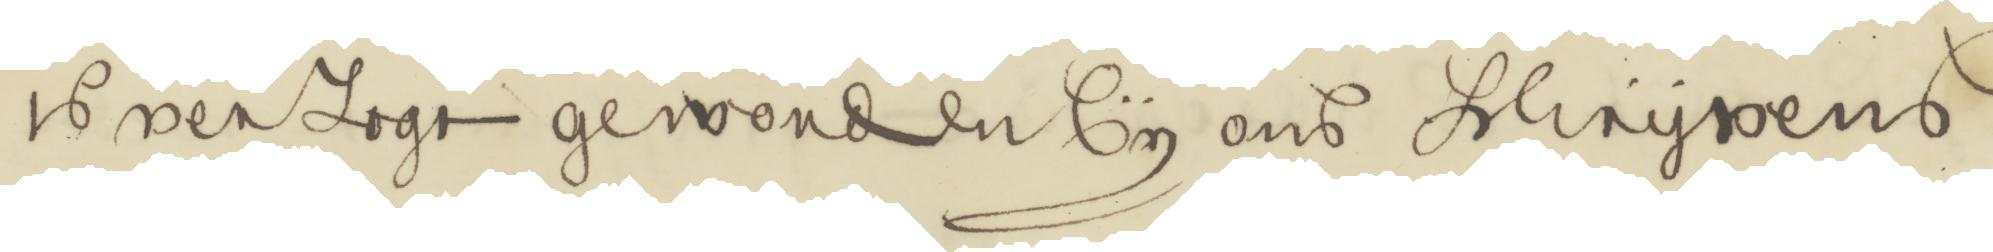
is verzogt geworden bij ons schrijvens
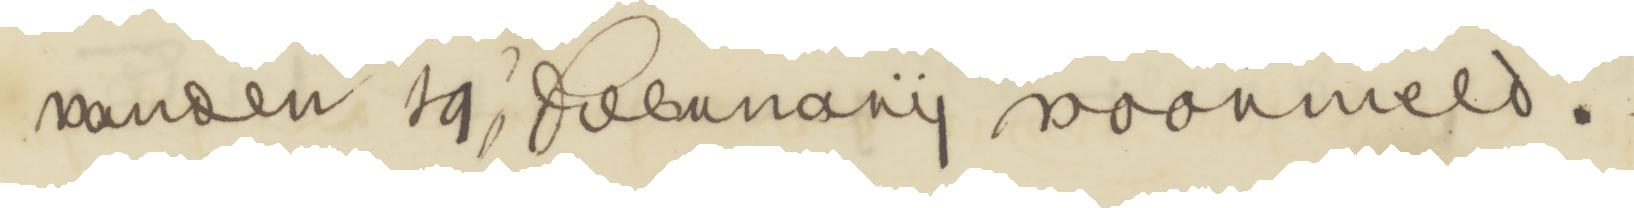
van den 14„' februarij voormeld.
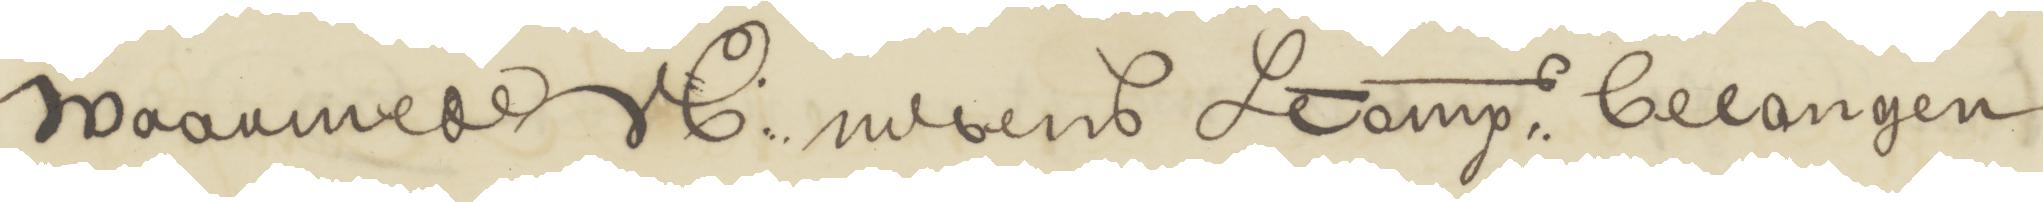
waarmede VE:.. nevens sComp„s belangen
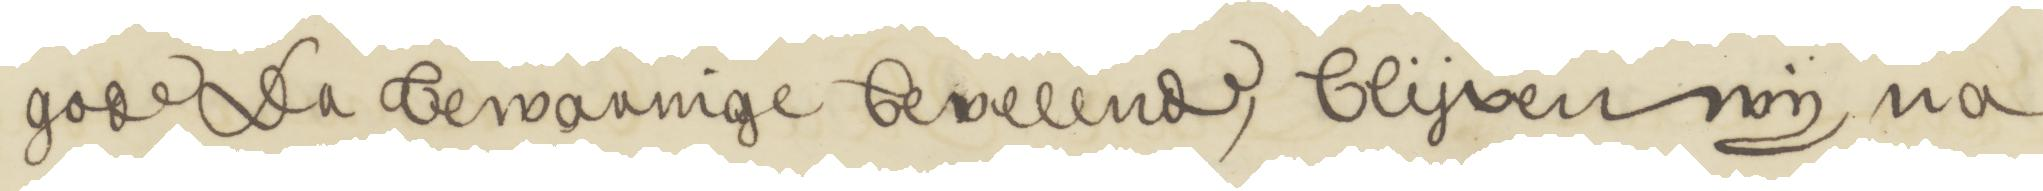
gode ter bewaringe bevelende, blijven wij na
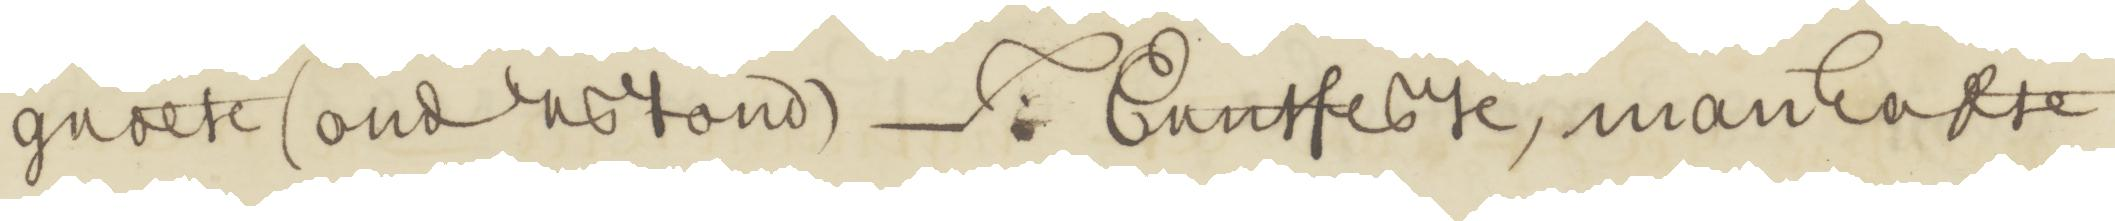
groete (onderstond) E: Erntfeste, manhafte
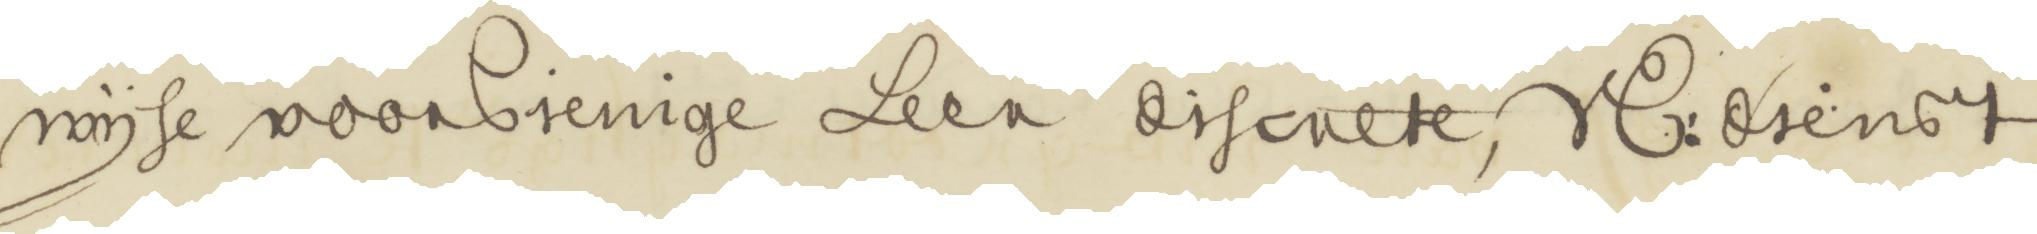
wijse voorsienige seer discrete, VE: dienst
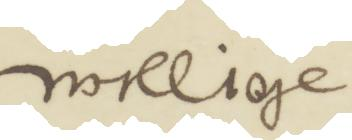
willige
